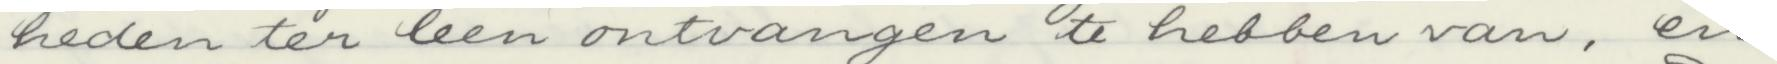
heden ter leen ontvangen te hebben van, en
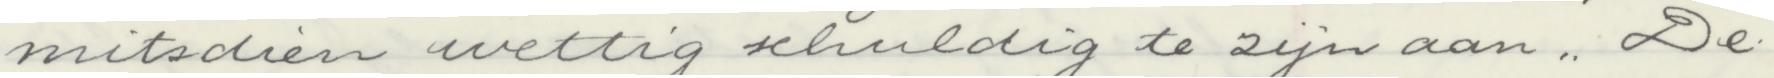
mitsdien wettig schuldig te zijn aan „ De
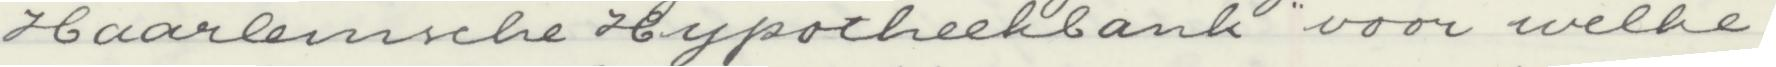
Haarlemsche Hypotheekbank " voor welke
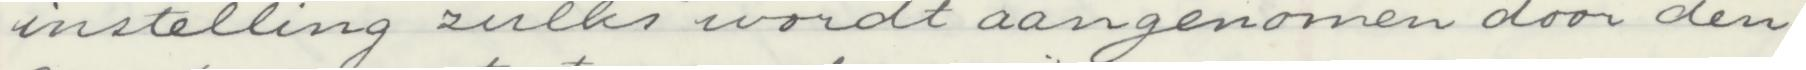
instelling zulks wordt aangenomen door den
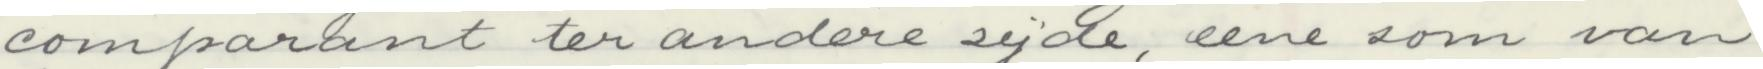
comparant ter andere zijde, eene som van
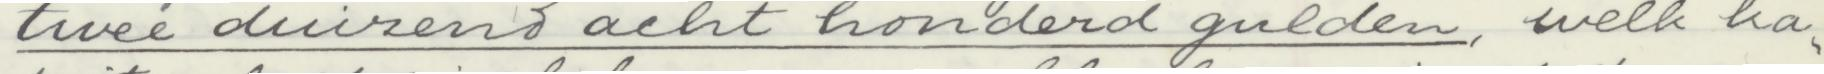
twee duizend acht honderd gulden, welk ka
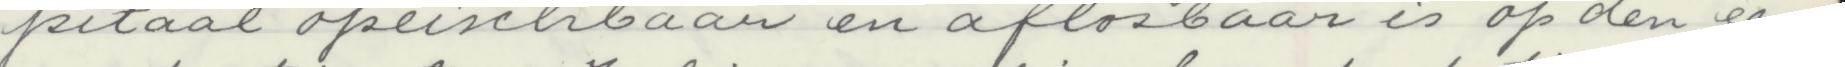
pitaal opeischbaar en aflosbaar is op den een
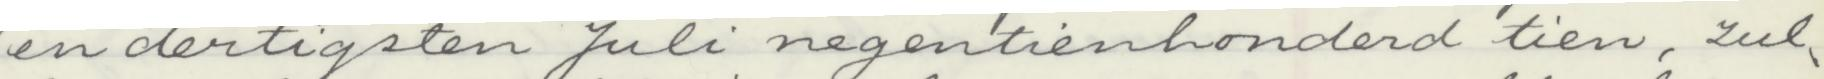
en dertigsten Juli negentienhonderd tien, zul
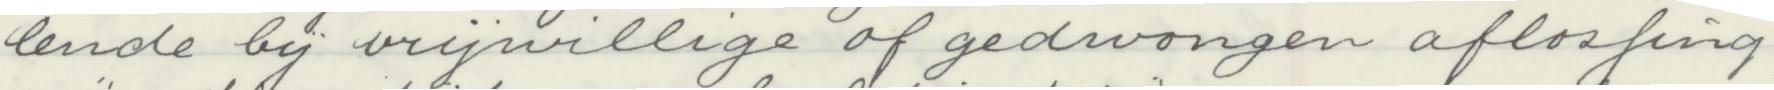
lende bij vrijwillige of gedwongen aflossing
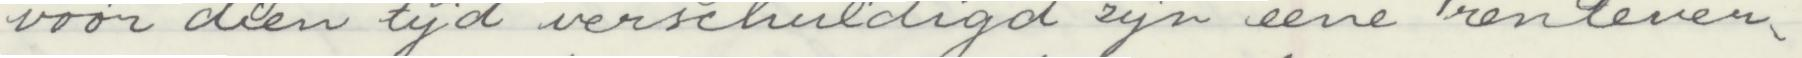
vóór dien tijd verschuldigd zijn eene rentever„
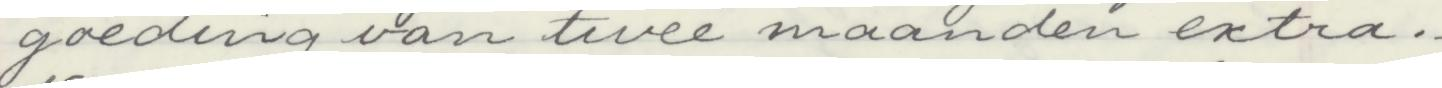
goeding van twee maanden extra.
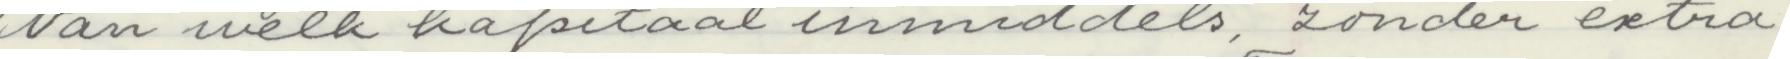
van welk kapitaal inmiddels, zonder extra
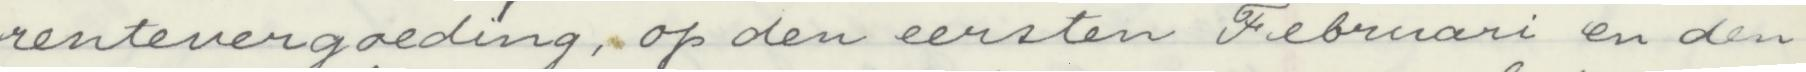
rentevergoeding, op den eersten Februari en den
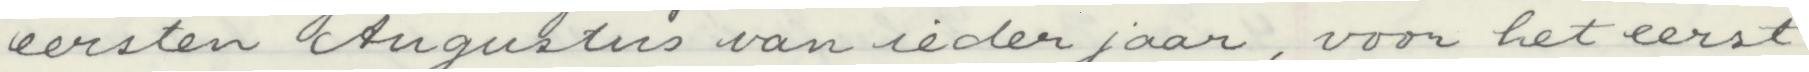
eersten Augustus van ieder jaar, voor het eerst
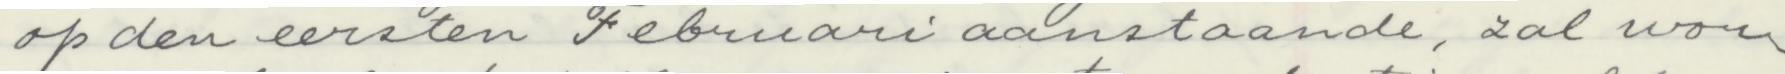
op den eersten Februari aanstaande, zal wor
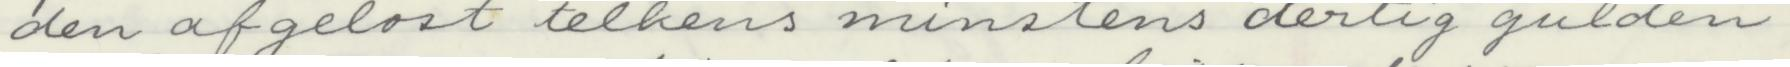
den afgelost telkens minstens dertig gulden
